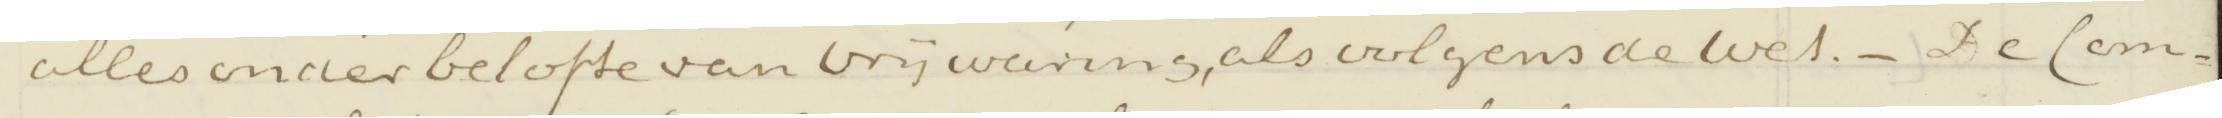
alles onder belofte van vrijwaring, als volgens de wet. _ De Com=
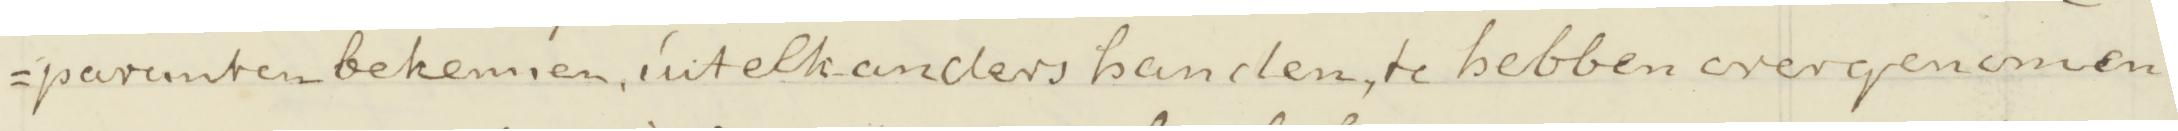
=paranten bekennen, uit elkanders handen, te hebben overgenomen
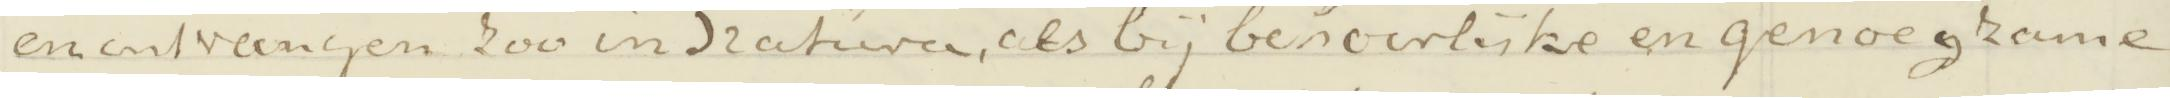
en ontvangen zoo in natura, als bij behoorlijke en genoegzame
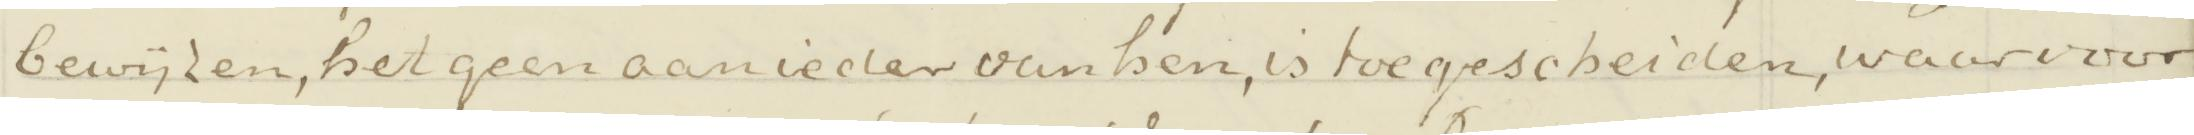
bewijzen, het geen aan ieder van hen, is toegescheiden, waarvoor
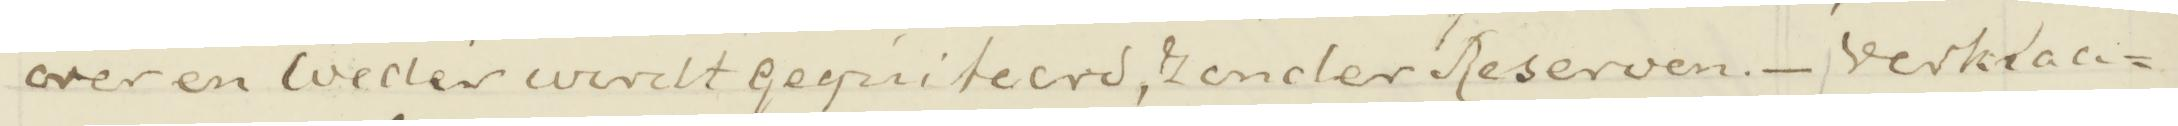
over en weder wordt gequiteerd, zonder Reserven. _ Verklaa=
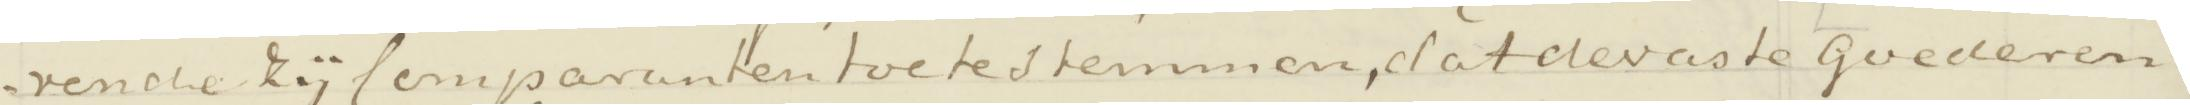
rende zij Comparanten toe te stemmen, dat de vaste Goederen
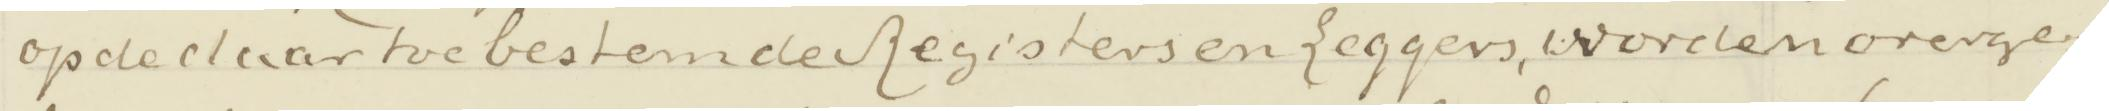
op de daar toe bestemde Registers en Leggers, worden overge=
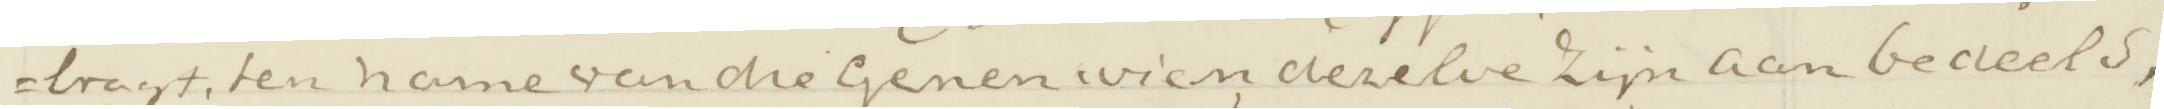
=bragt, ten name van die genen wien dezelve zijn aan bedeeld,
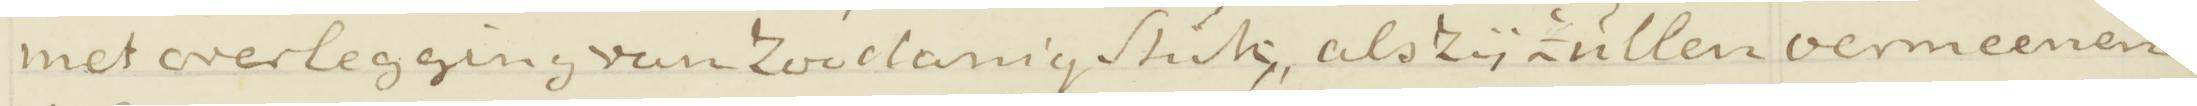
met overlegging van zoodanig stuk, als zij zullen vermeenen
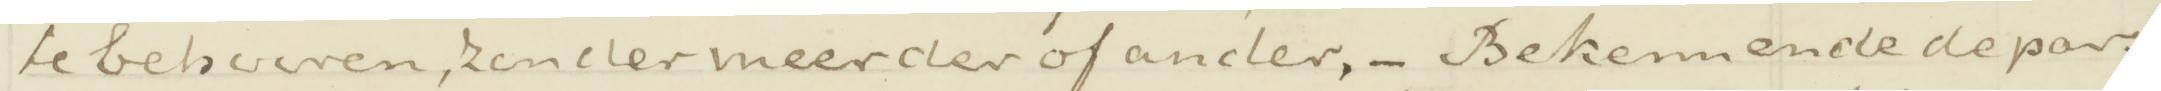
te behooren, zonder meerder of ander, – Bekennende de par=
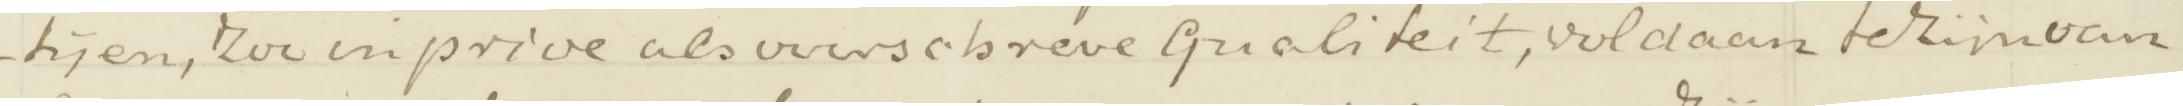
=tijen, zoo in prive als voorschreve qualiteit, voldaan te zijn van
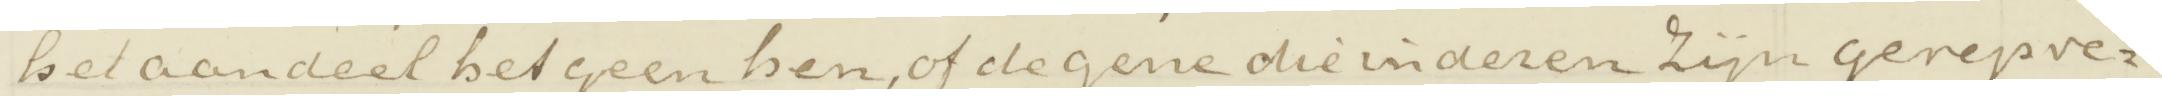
het aandeel het geen hen, of de gene die in dezen zijn gerepre=
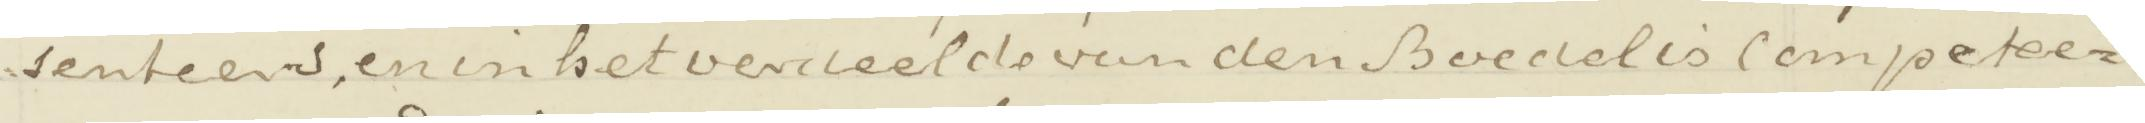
=senteerd, en in het verdeelde van den Boedel is Competee=
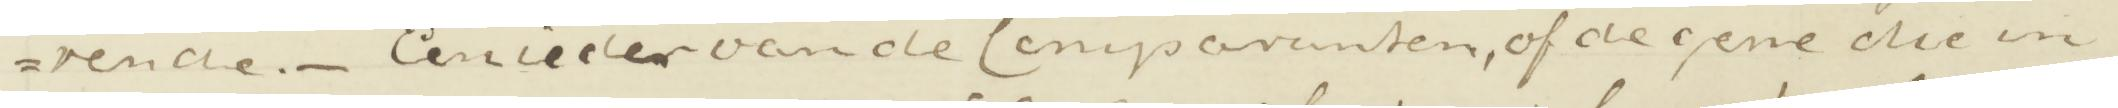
=rende. – Een ieder van de Comparanten, of de gene die in
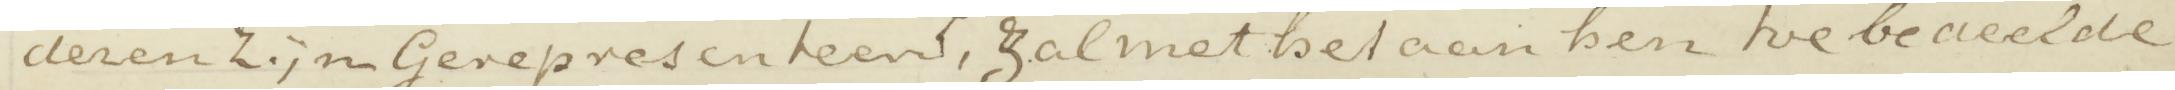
dezen zijn Gerepresenteerd, zal met het aan hen toebedeelde
